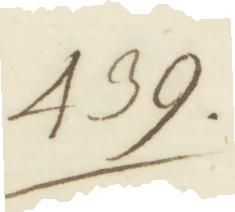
439.
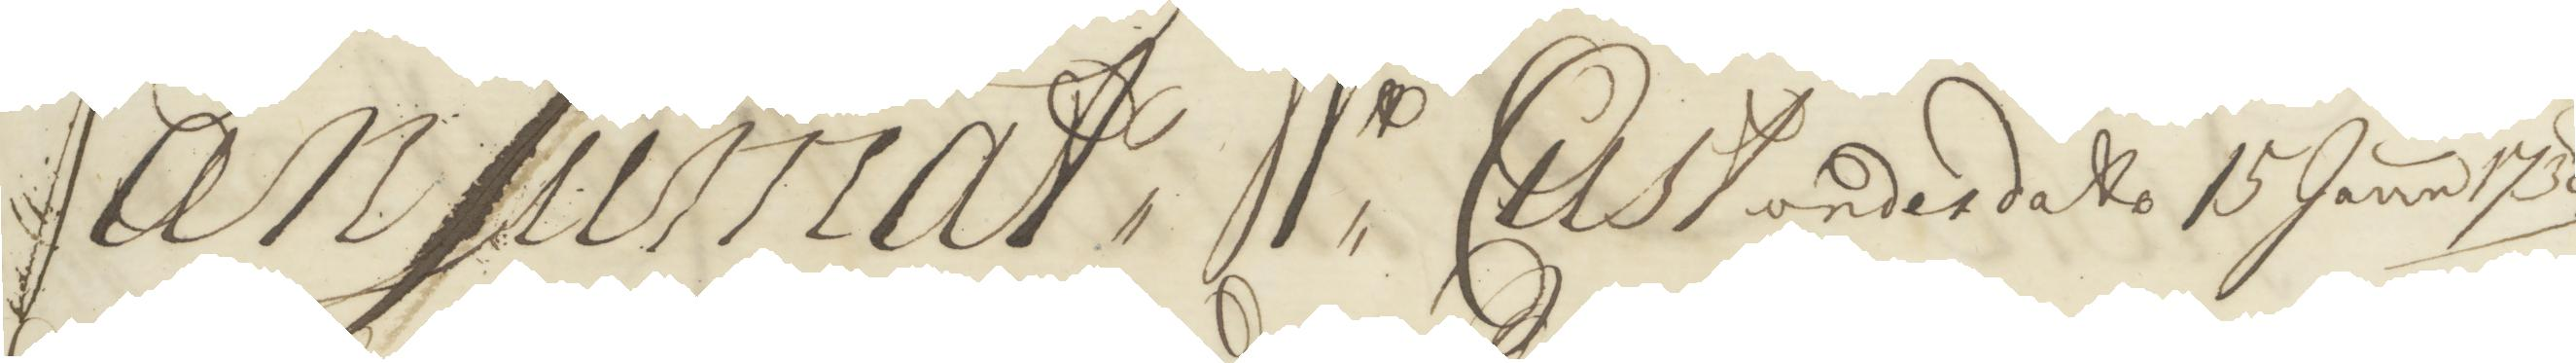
Van Sumat„s W„t Cust onder dato 15 Jann 173
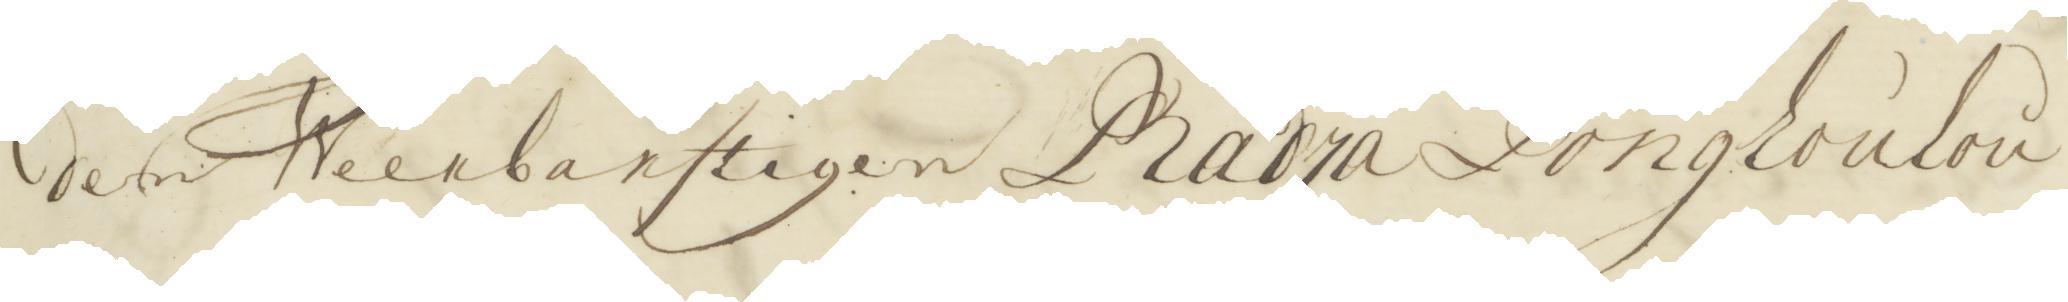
den Weerbarstigen Radja Ponghoulou
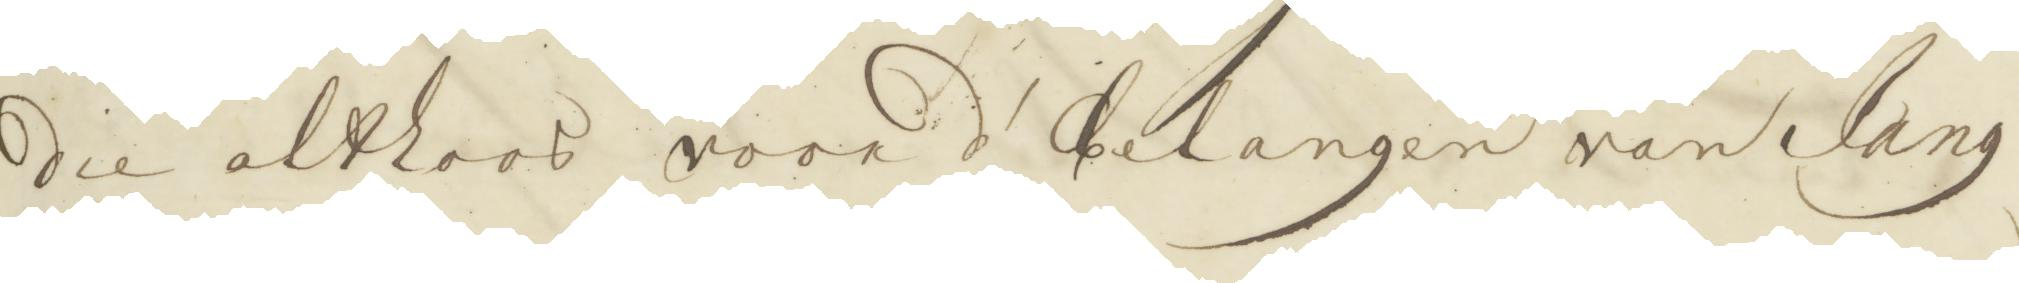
die althoos voor d’ belangen van Jang
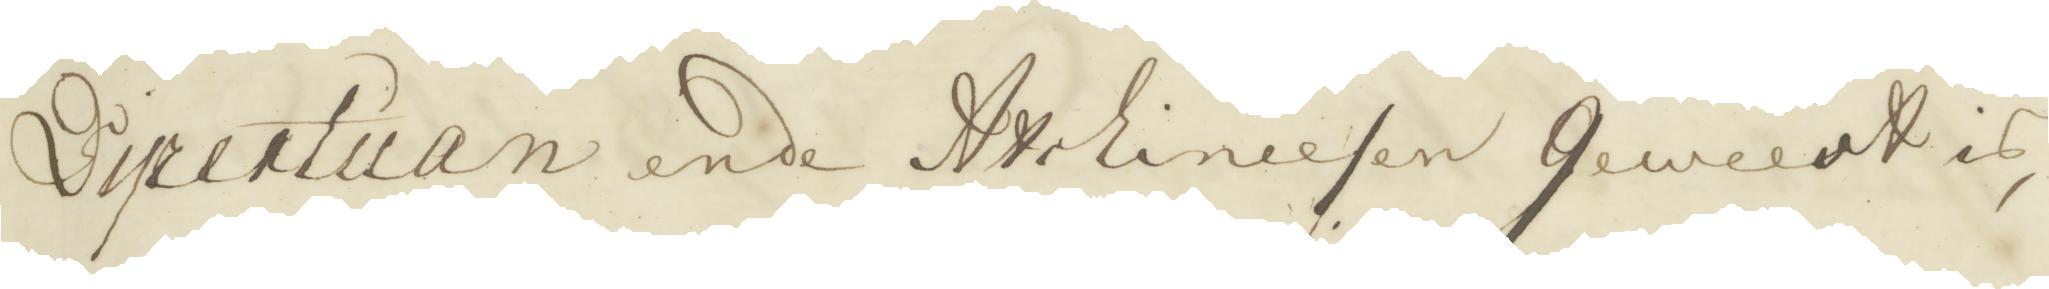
Dipertuan ende Atchineesen geweest is,
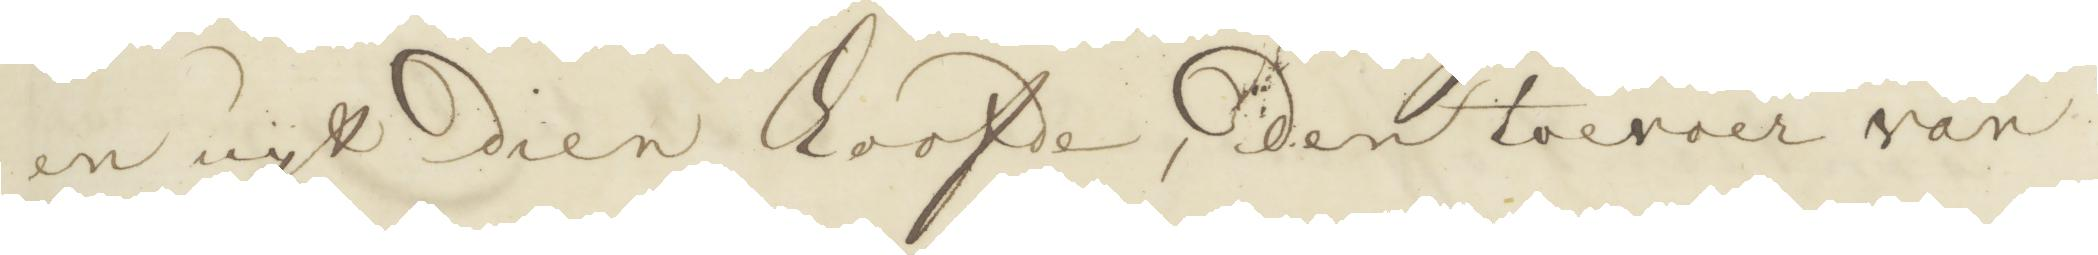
en uijt dien hoofde, den toevoer van
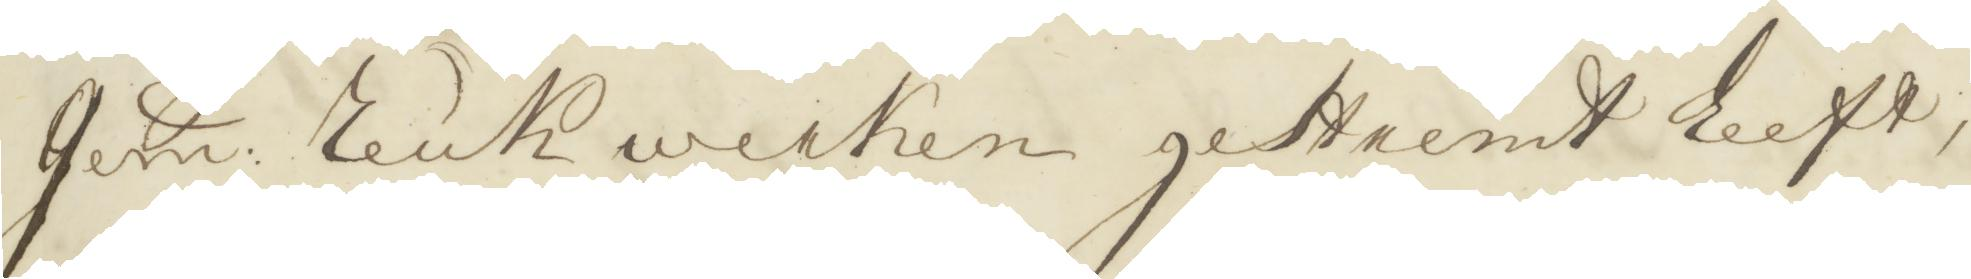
gem: reuk werken gestremt heeft,
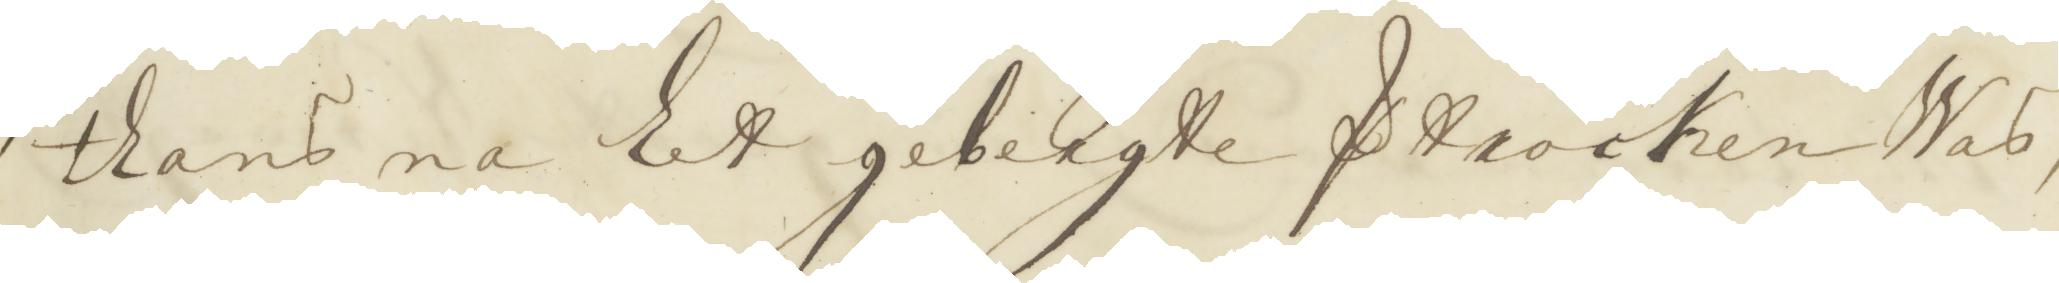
thans na het gebergte vertrocken Was
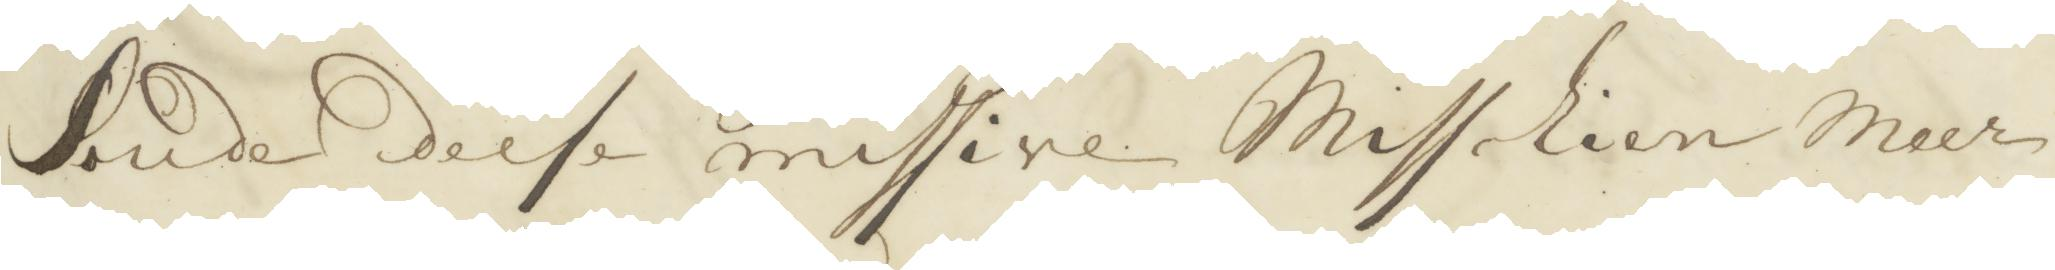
soude deese missive Misschien meer
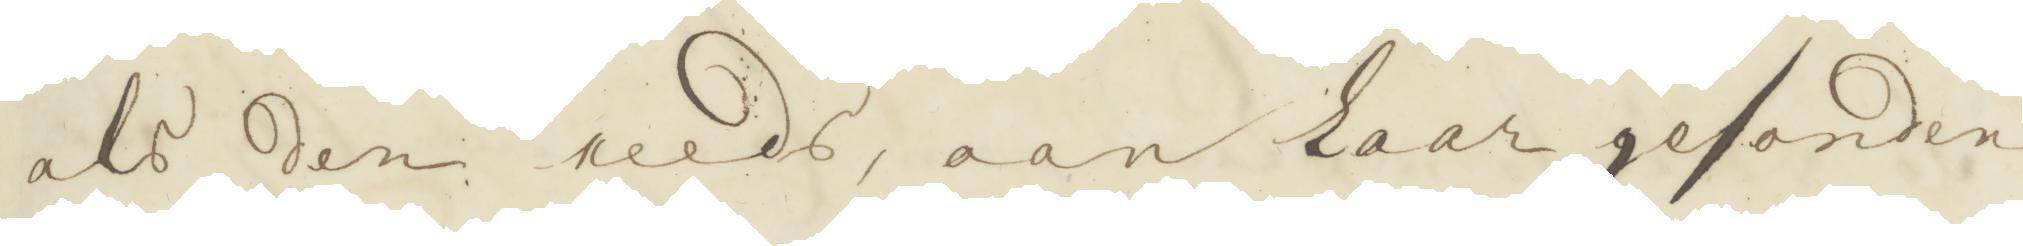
als den reeds, aan haar gesonden
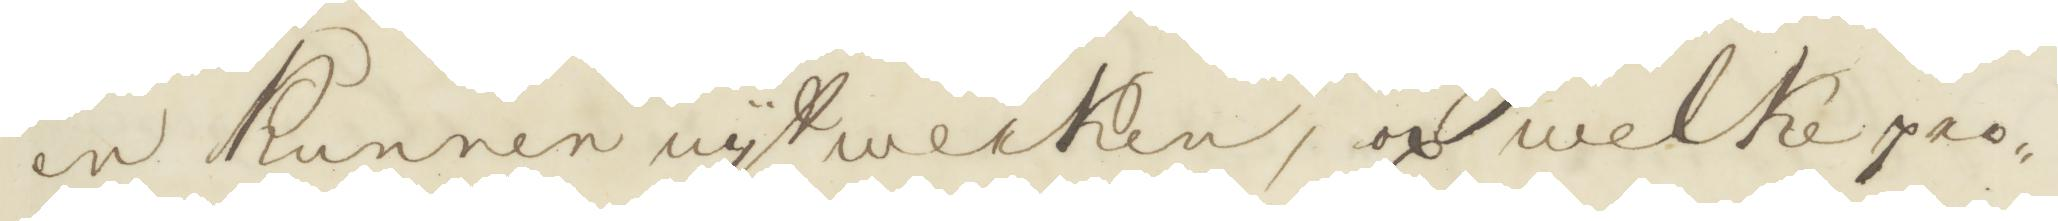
en kunnen uijtwerken, op welke pro„
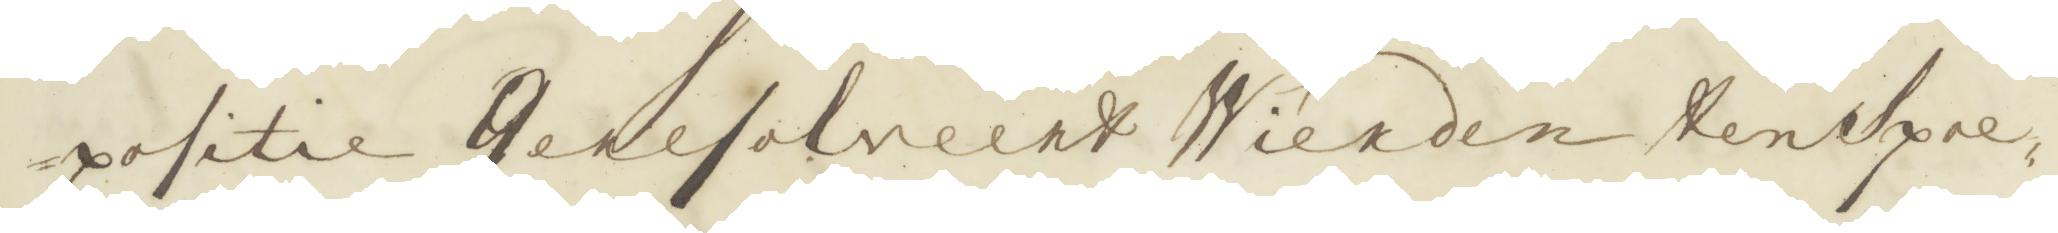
=positie Geresolveert Wierden ten spoe„
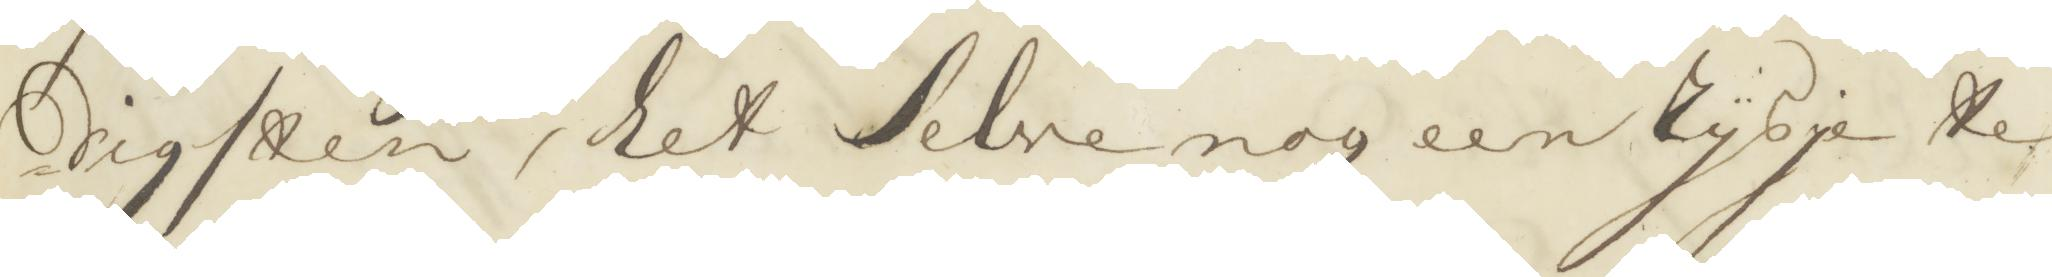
=digsten, het selve nog een rijsje te
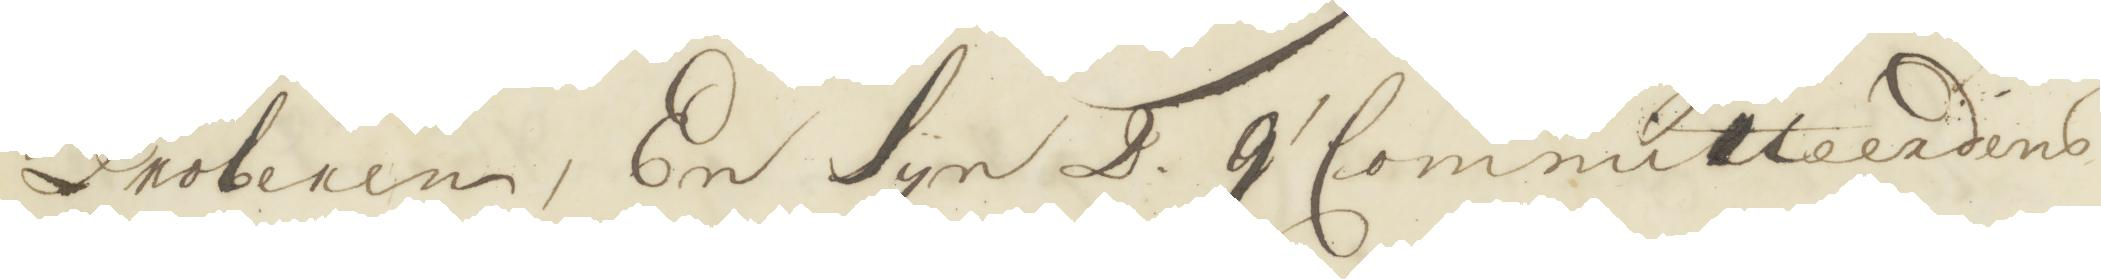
Proberen, En sijn E. G’Committeerdens
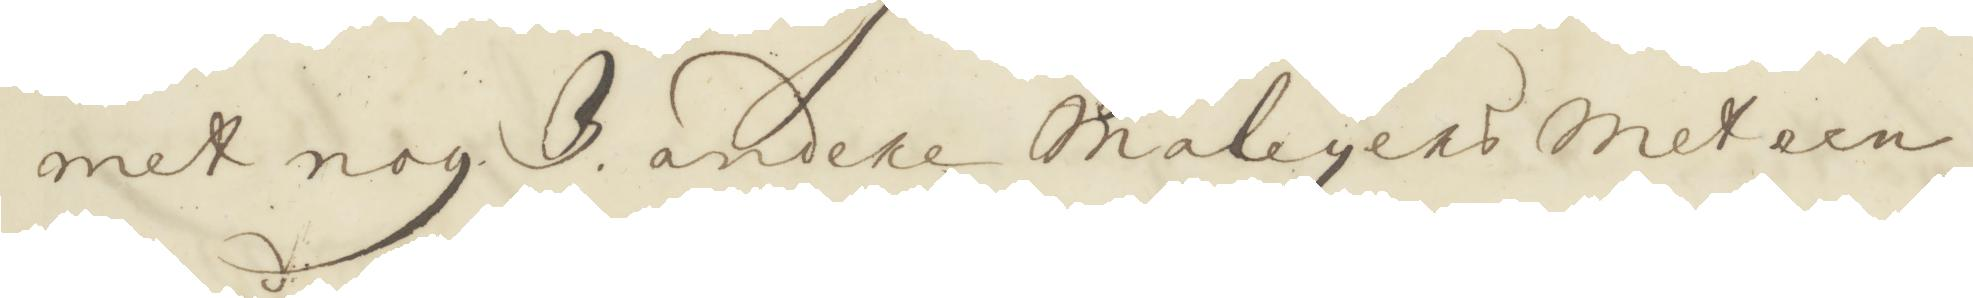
met nog 3. andere maleijers met een
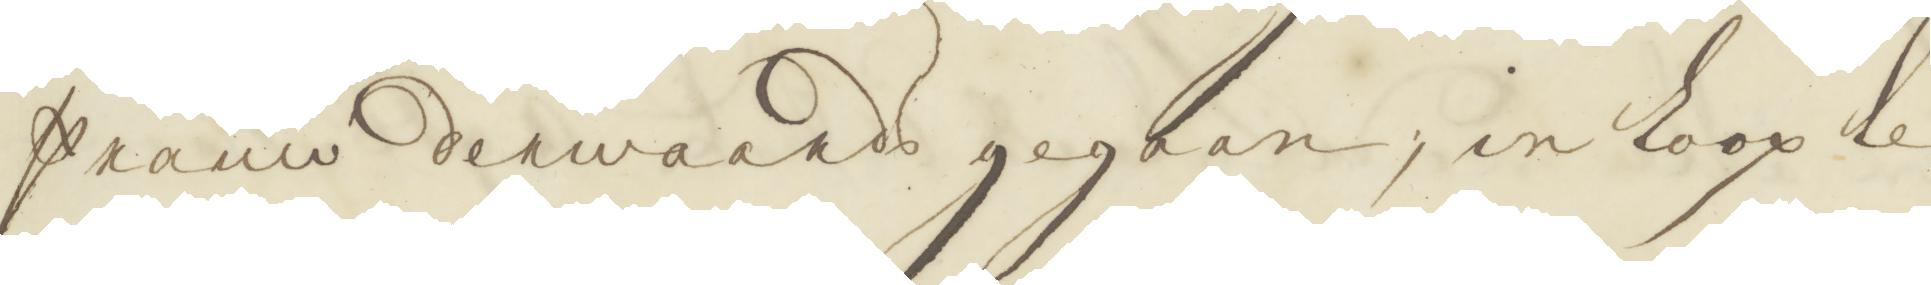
prauw derwaards gegaan, in hoop le
